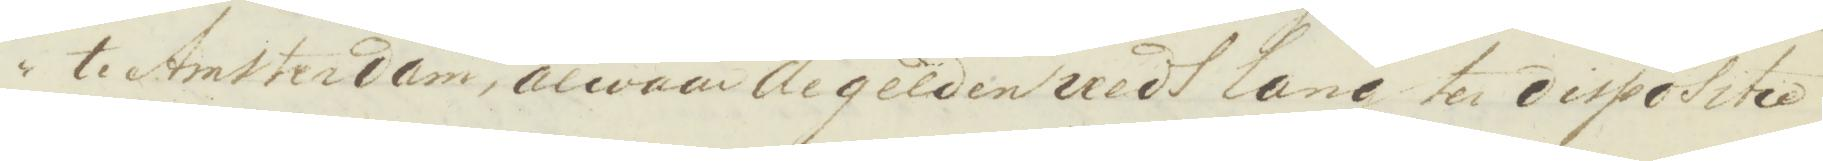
„ te Amsterdam, alwaar de gelden reeds lang ter dispositie
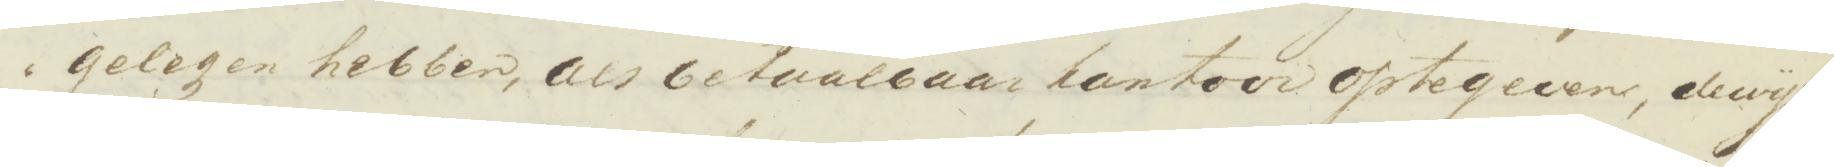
„ gelegen hebben, als betaalbaar kantoor op te geven, dewijl
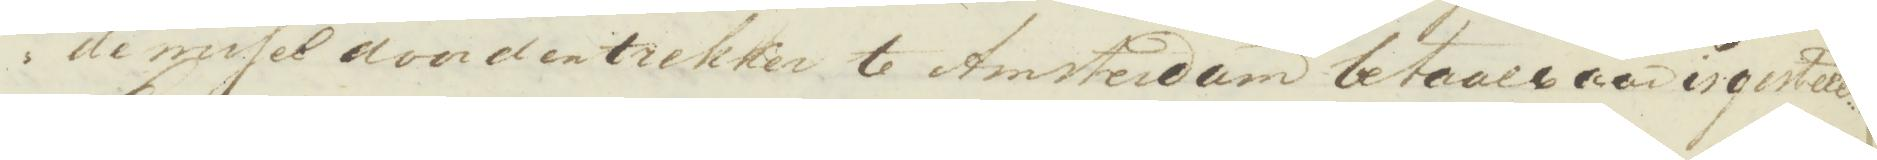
„ de wissel door den trekker te Amsterdam betaalbaar is gesteld.
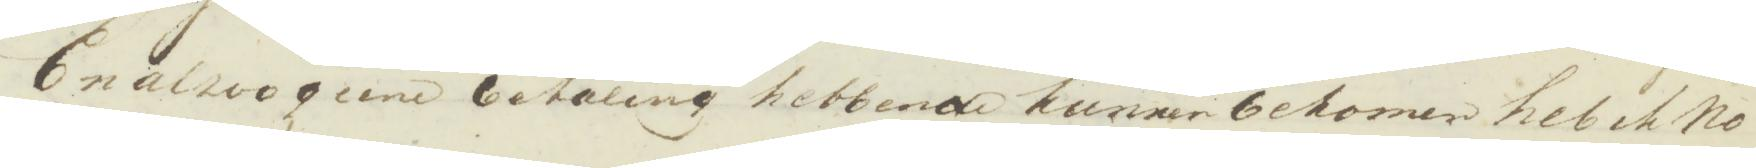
En alzoo geene betaling hebbende kunnen bekomen heb ik No
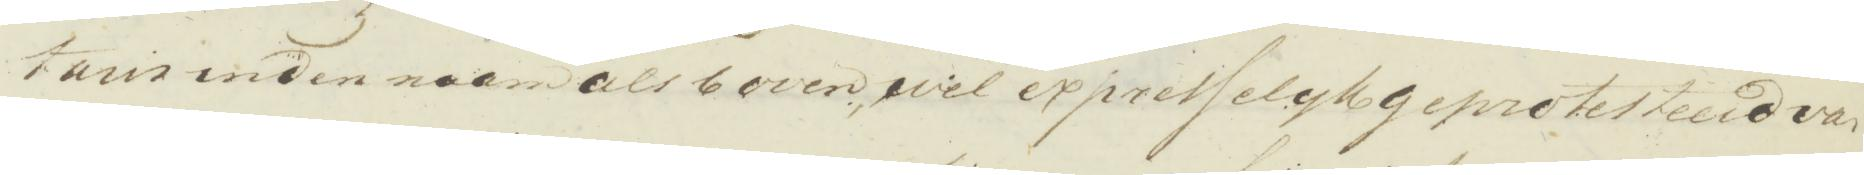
taris in den naam als boven, wel expresselyk geprotesteerd van
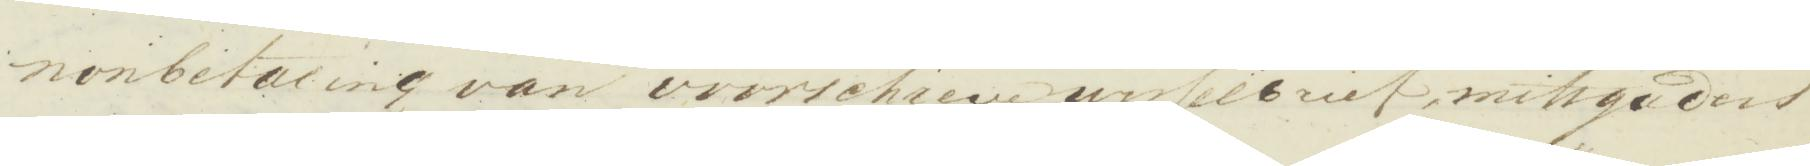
nonbetaling van voorschreve wisselbrief, mitsgaders
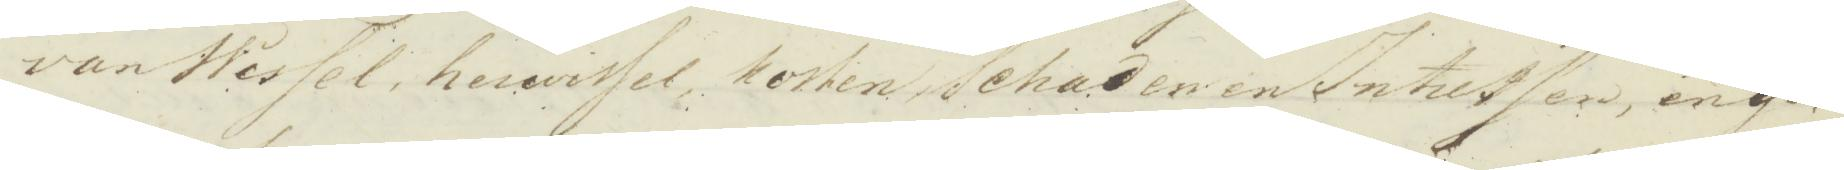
van Wissel, herwissel, kosten, schaden en Intressen, en ge,
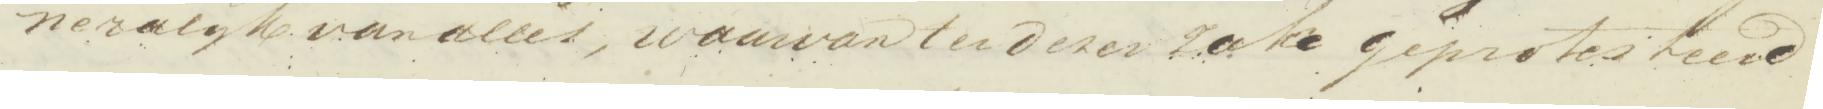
neralyk van alles, waarvan ter deser zake geprotesteerd
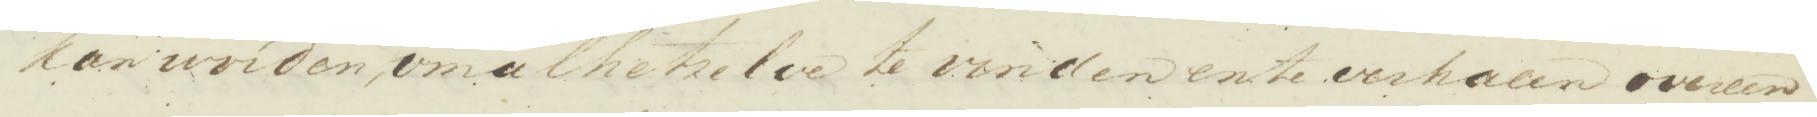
kan worden, om al hetzelve te vinden en te verhalen overeen
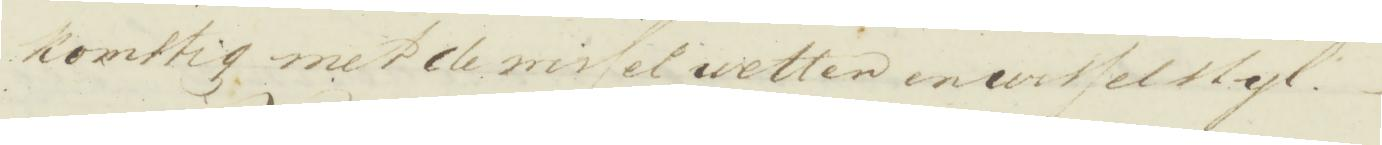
komstig met de wisselwetten en wisselstyl.
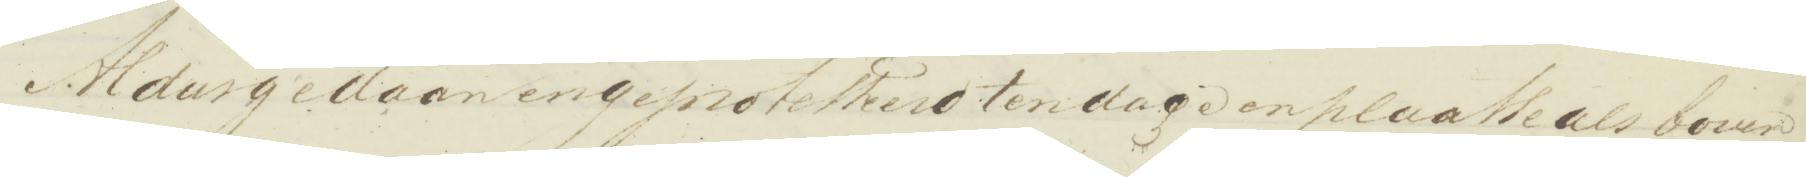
Aldus gedaan en geprotesteerd ten dage en plaatse als boven
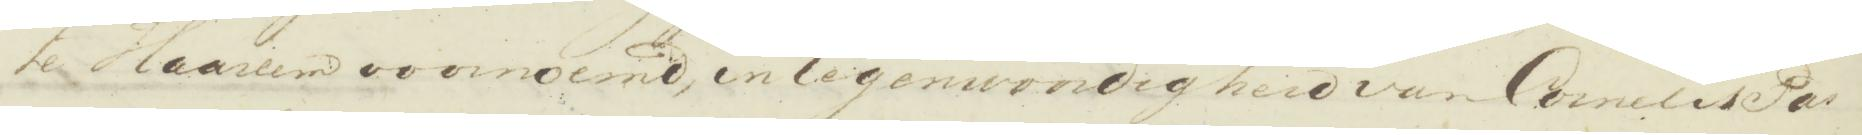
te Haarlem voornoemd, in tegenwordigheid van Cornelis Pas
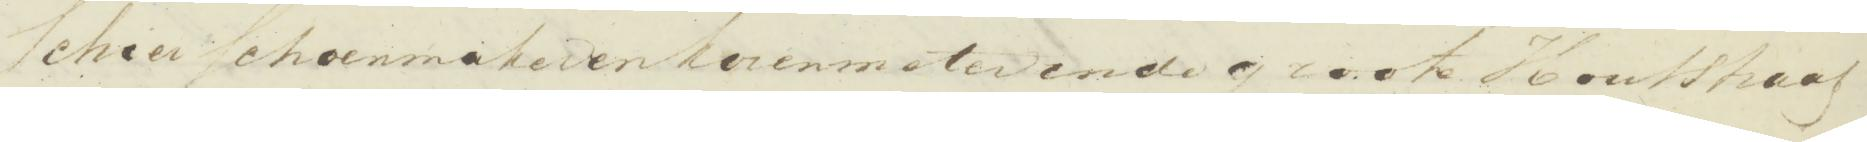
schier schoenmaker en korenmeter in de groote Houtstraat
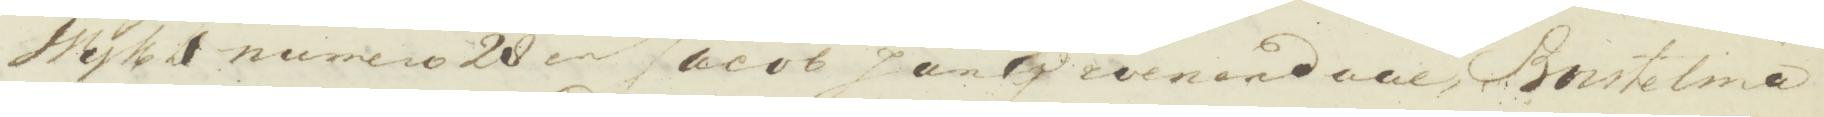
Wyk 4 numero 28 en Jacob Jan Groenendaal, Borstelina
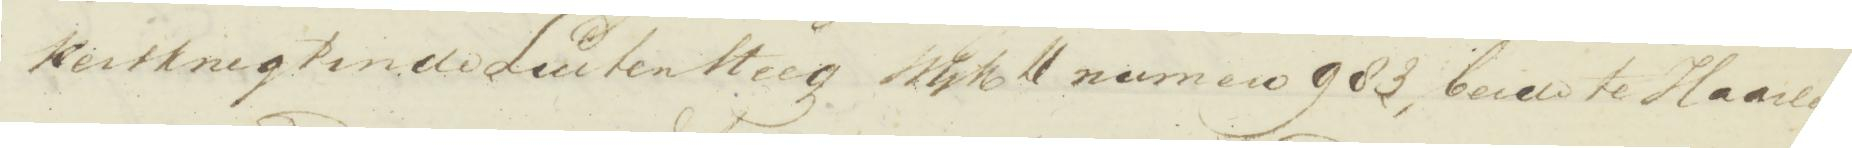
Kestknegt in de Luitensteeg Wyk 4 numero 983, beide te Haarlem
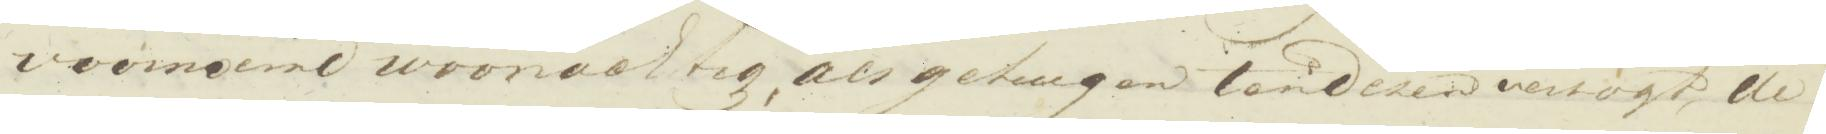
voornoemd woonachtig, als getuigen ten desen versogt de
